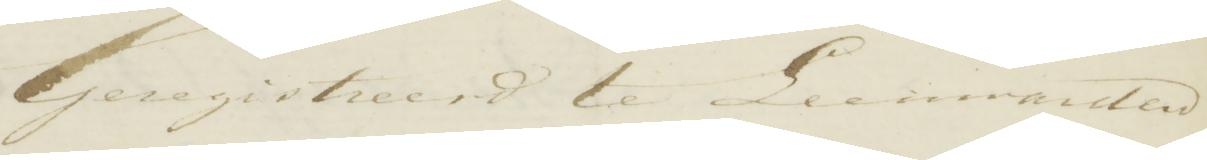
Geregistreerd te Leeuwarden
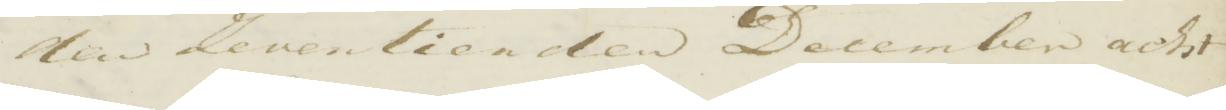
den Zeventienden December acht
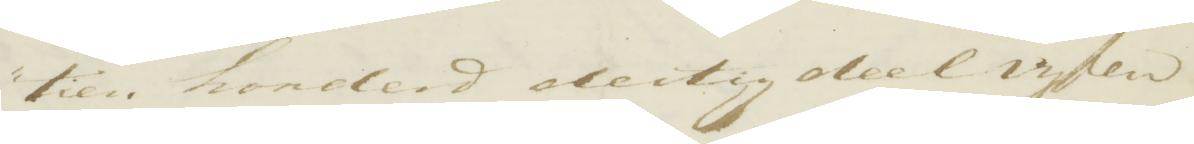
"tien honderd dertig deel vyfen
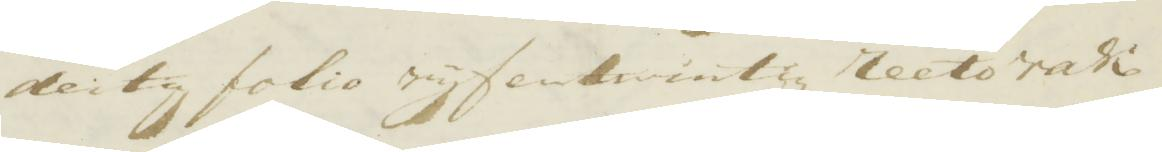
dertig folio vijfentwintig recto vak
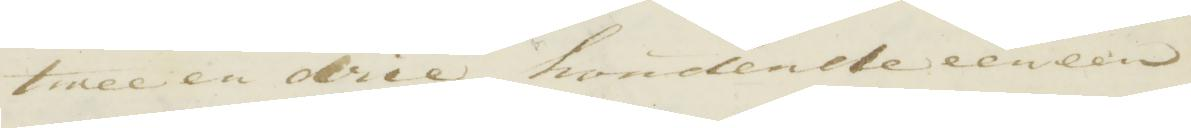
twee en drie, houdende een een
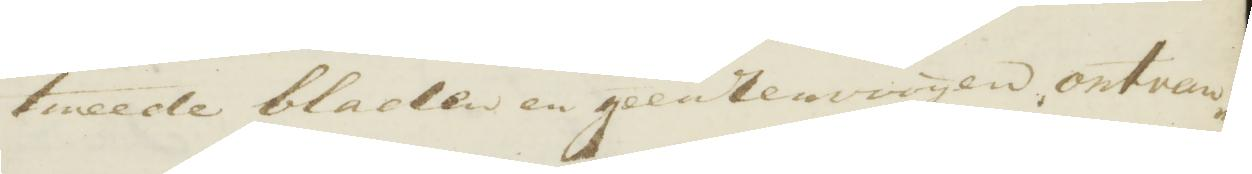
tweede bladen en geen renvooijen, ontvan„
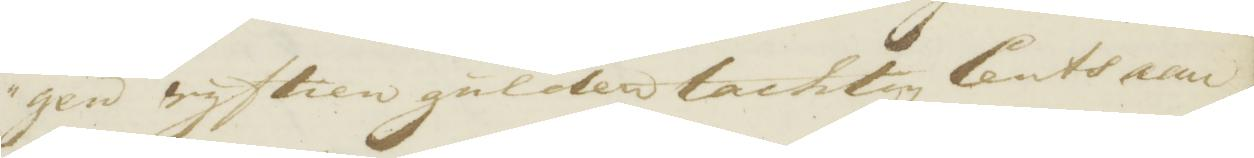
"gen vijftien gulden tachtig Cents aan
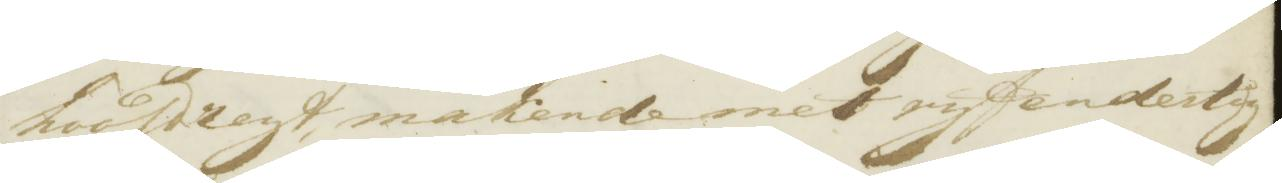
hoofdregt, makende met vyfendertig
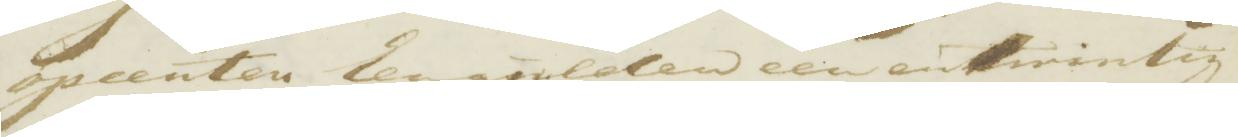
opcenten Een gulden een en twintig
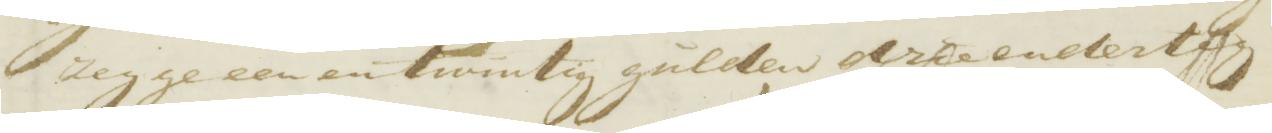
zegge een en twintig gulden drie en dertig
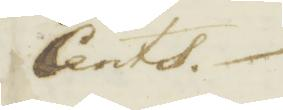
.Cents. —
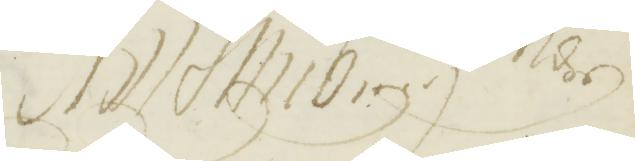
Ad v Limburg Stirum
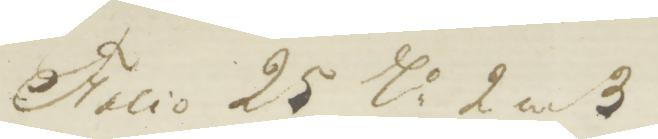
Folio 25 r„o 2 en 3
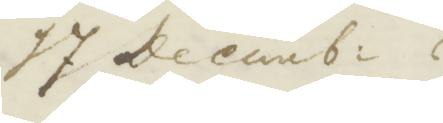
17 Decemb:
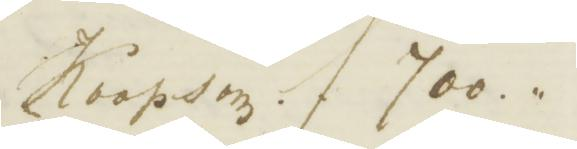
Koopsom . ƒ 700 . „
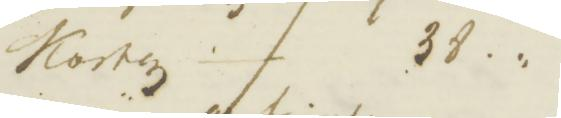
Korten — 38 . „
